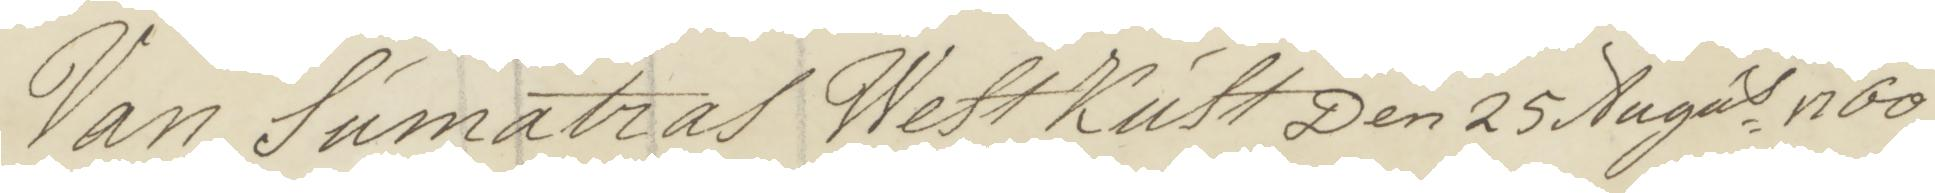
Van Sumatras West Kust Den 25 Augu=s 1760
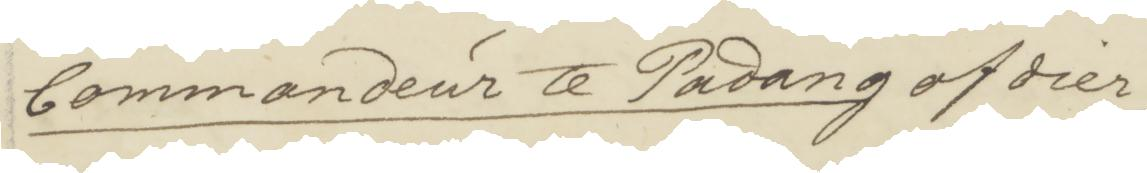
Commandeur te Padang of dier
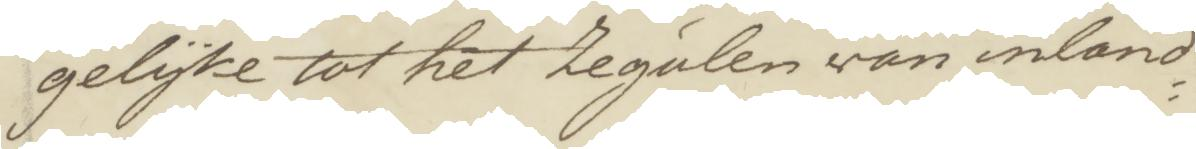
gelijke tot het zegulen van inland„
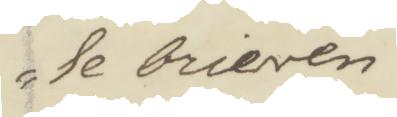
„se brieven
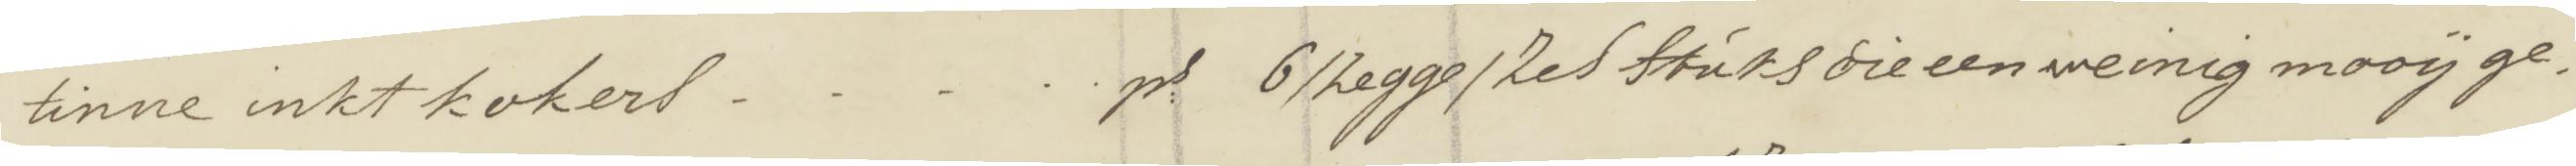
tinne inkt kokers - - - . .p:s 6 /zegge/ zes stuks die een weinig mooij ge‚
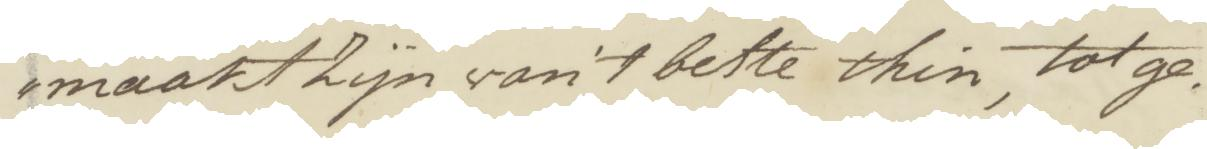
„maakt zijn van ’t beste thin, tot ge‚
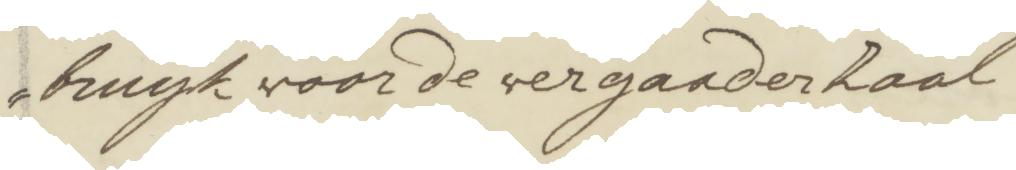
„bruijk voor de vergaader zaal
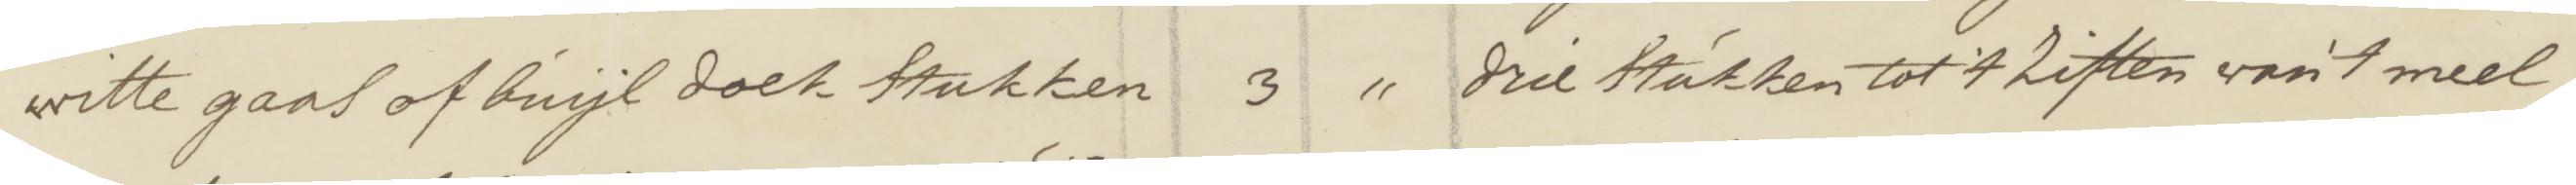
witte gaas of buijl doek stukken 3 „ drie stukken tot 't ziften van ’t meel
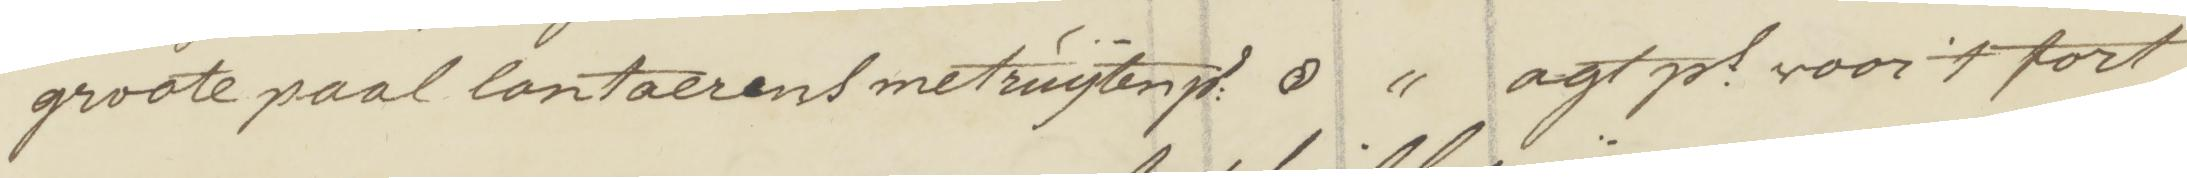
groote paal lantaerens met ruijten p:s 8 „ agt p:s voor ’t fort
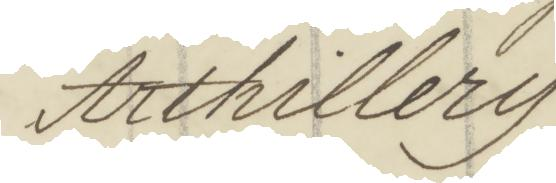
Arthillerij
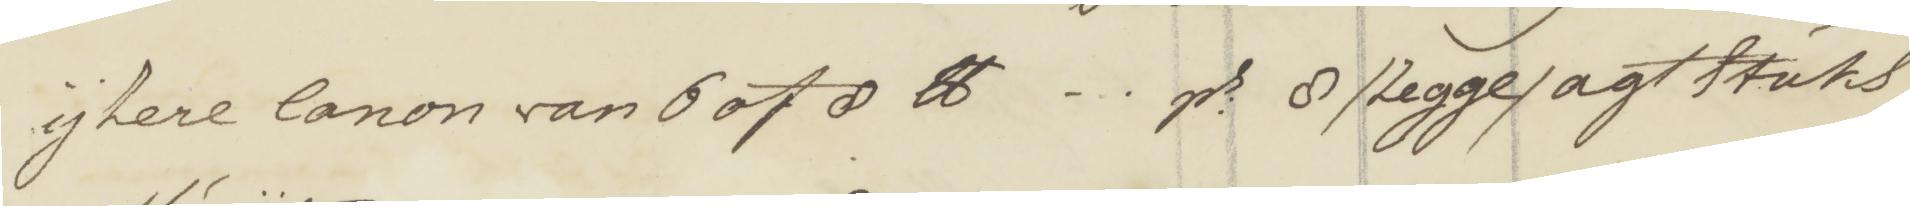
ijzere canon van 6 of 8 lb - . p:s 8 /zegge/ agt stuks
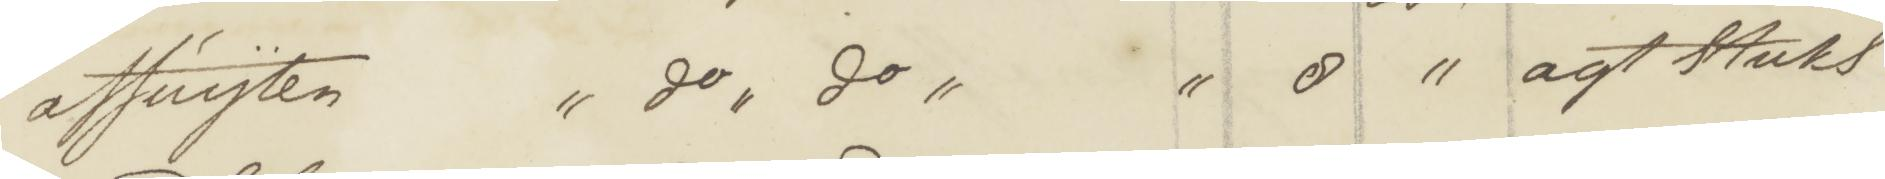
affuijten „ do „ do „ „ 8 „ agt stuks
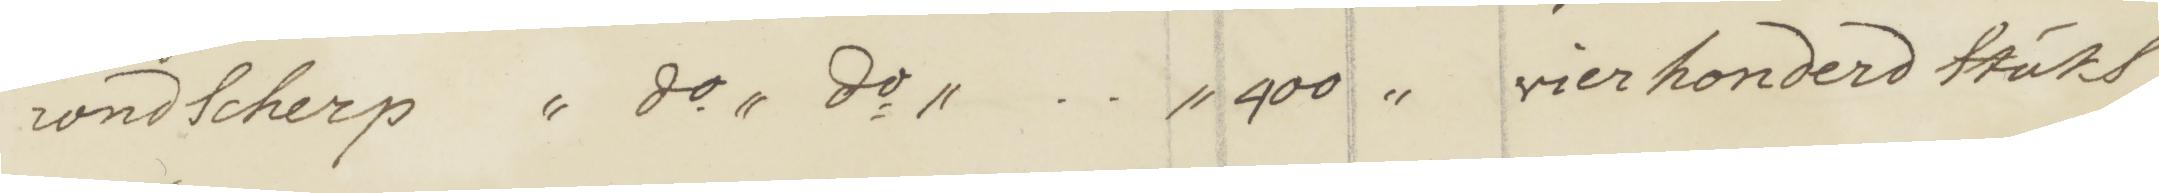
rondscherp „ d.o „ d=o „ „ 400 „ vier honderd stuks
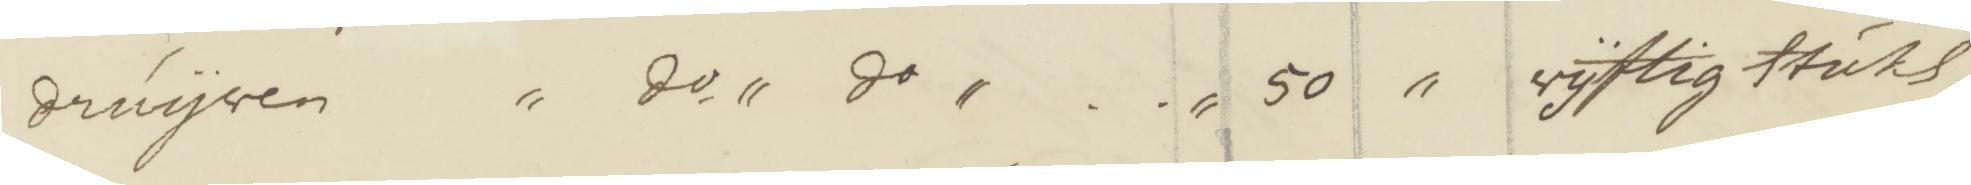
druijven „ d.o „ do „ „ 50 „ vijftig stuks
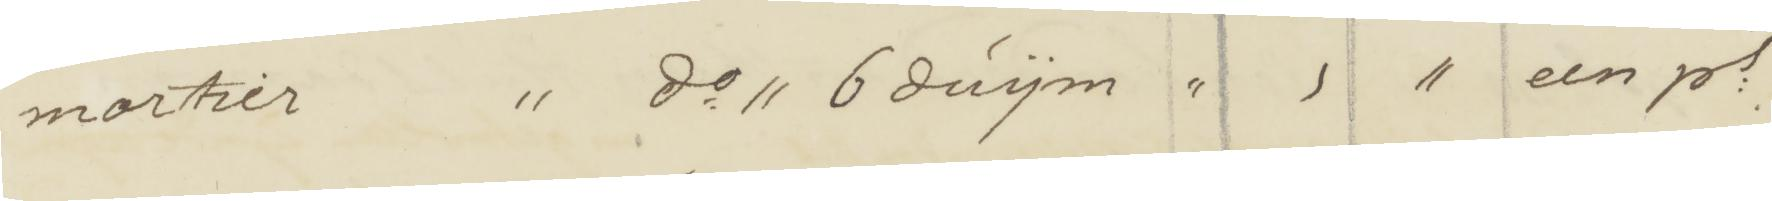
mortier „ d=o „ 6 duijm „ 1 „ een p:s
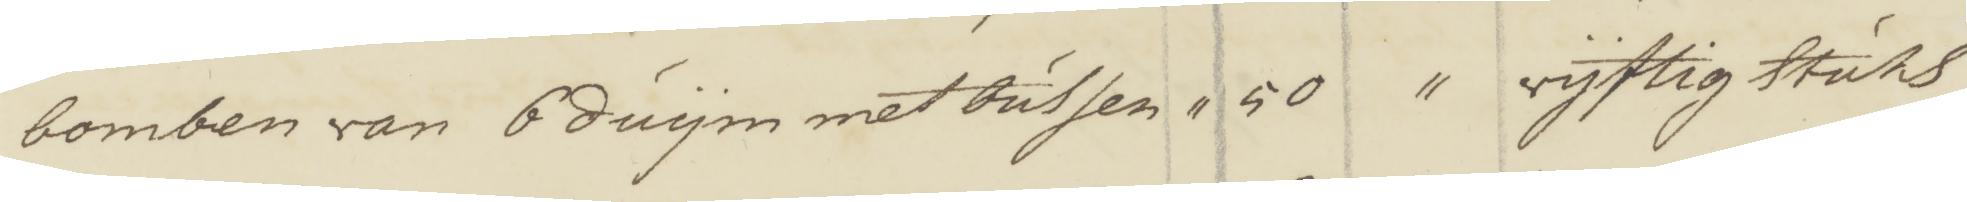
bomben van 6 duijm met bussen „ 50 „ vijftig stuks
